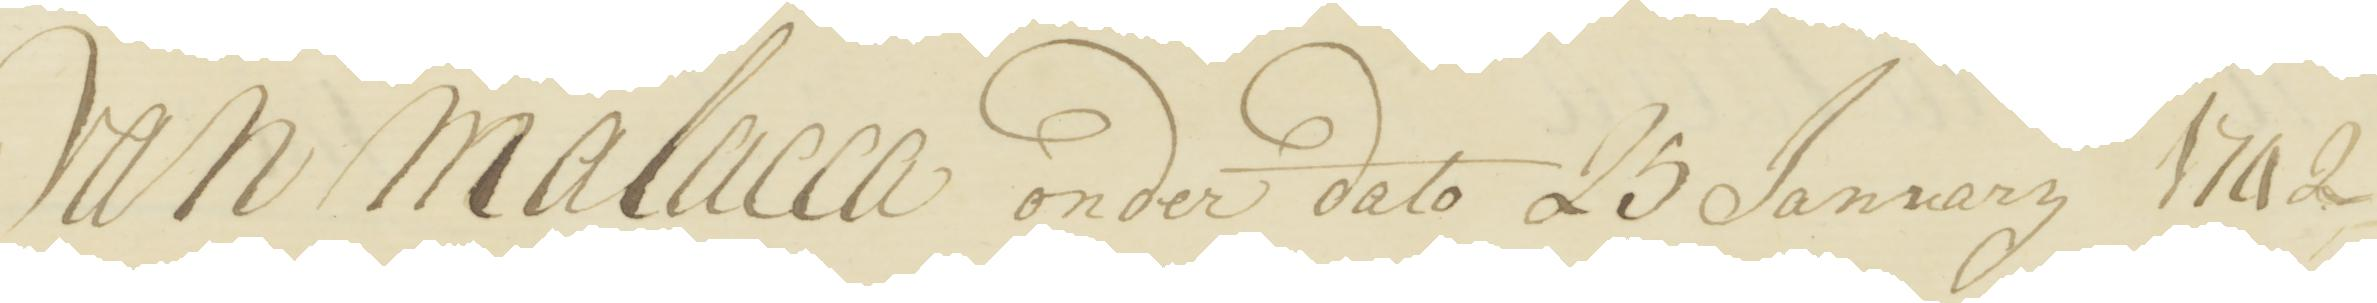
Van malacca onder dato 25 January 1742
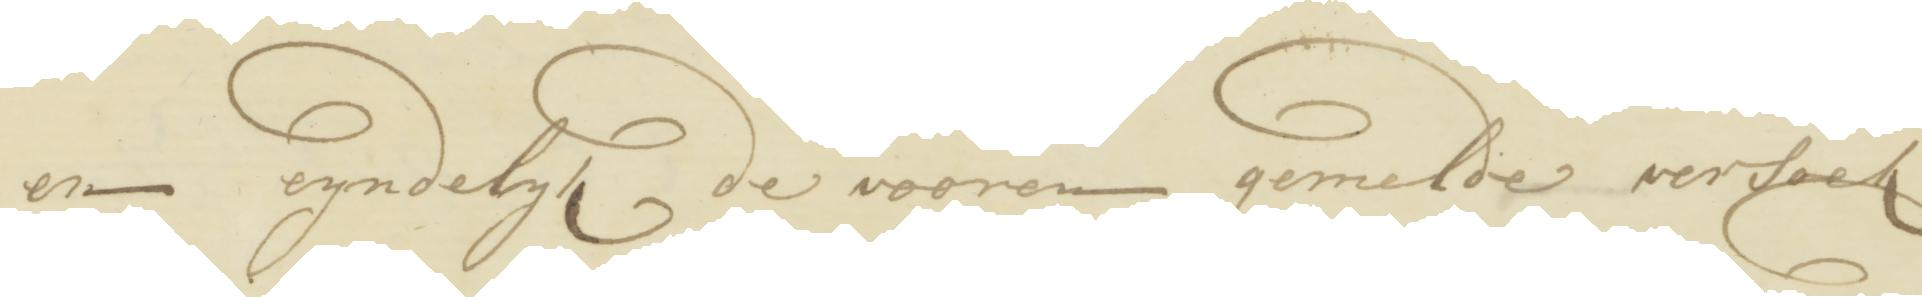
en eyndelyk de vooren gemelde versoek
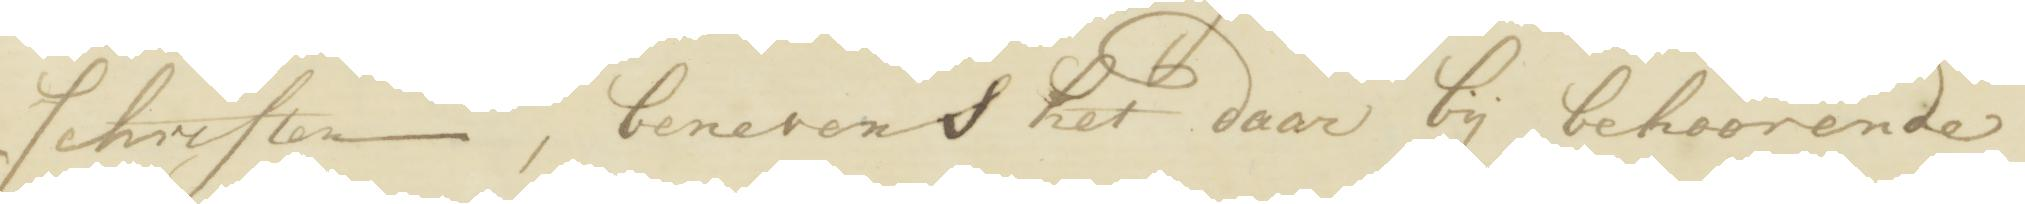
schriften, benevens het daar bij behoorende
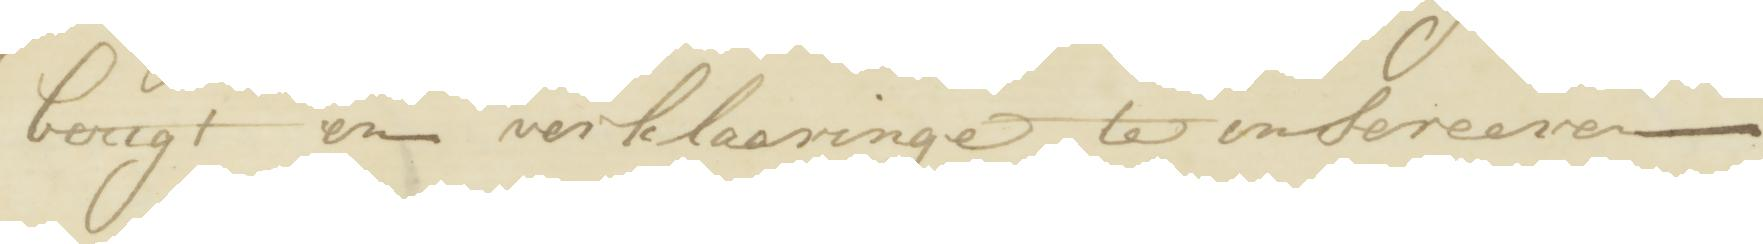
berigt en verklaaringe te insereeren
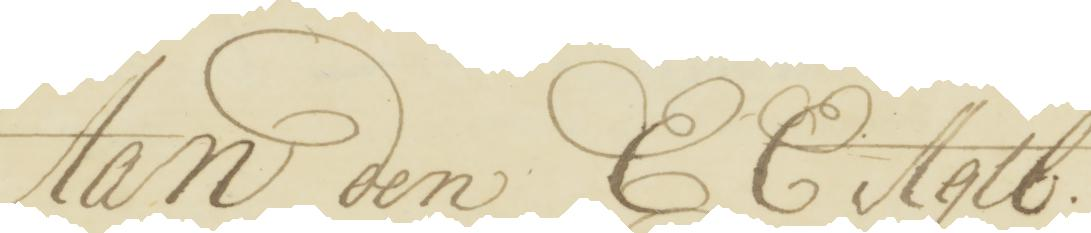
Aan den E E Agtb.
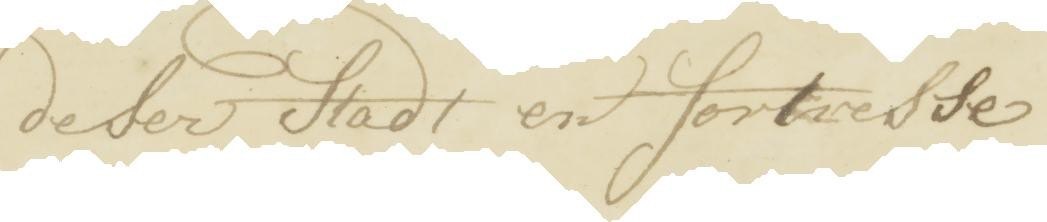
deser stadt en fortresse
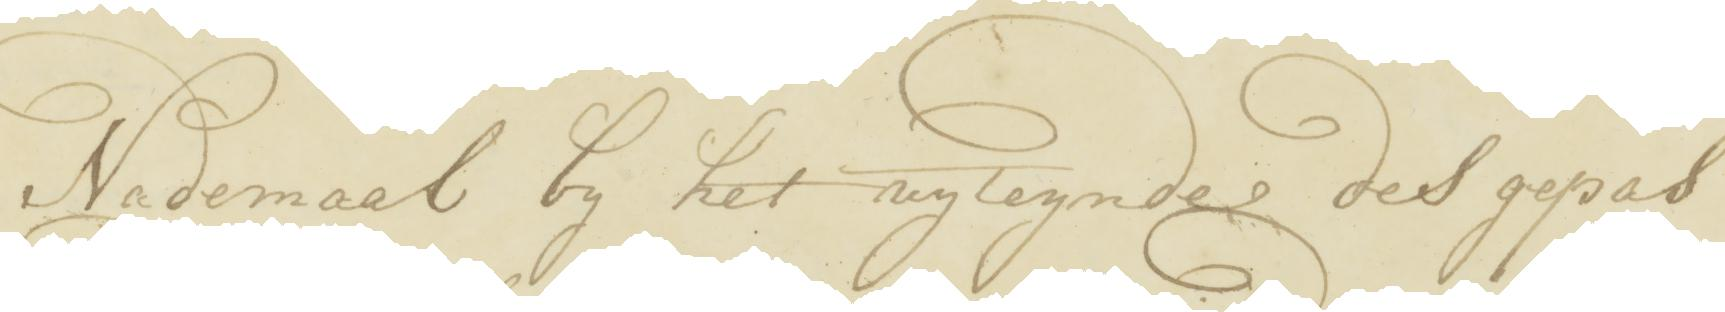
Nademaal by het uyteynde des gepas
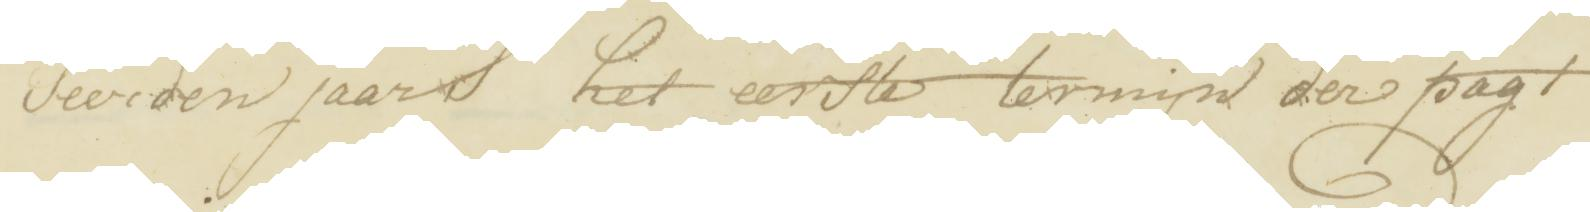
seerden jaars het eerste termijn der pagt
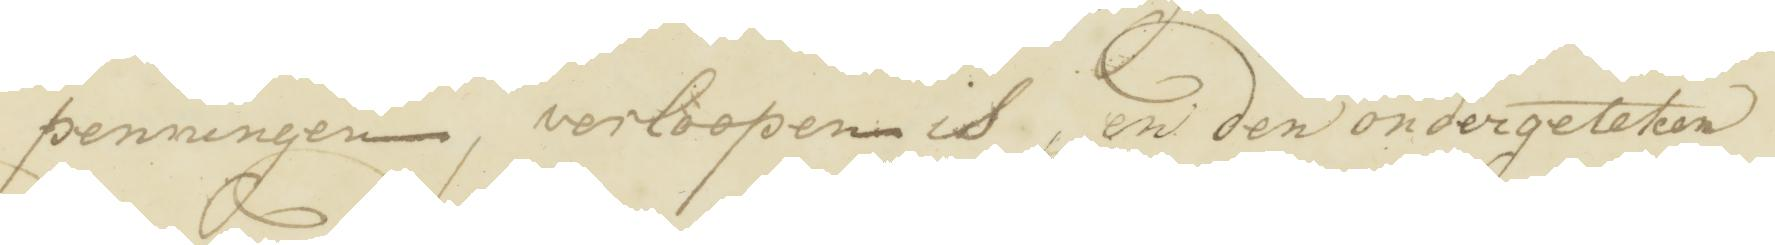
penningen, verloopen is, en den ondergeteken
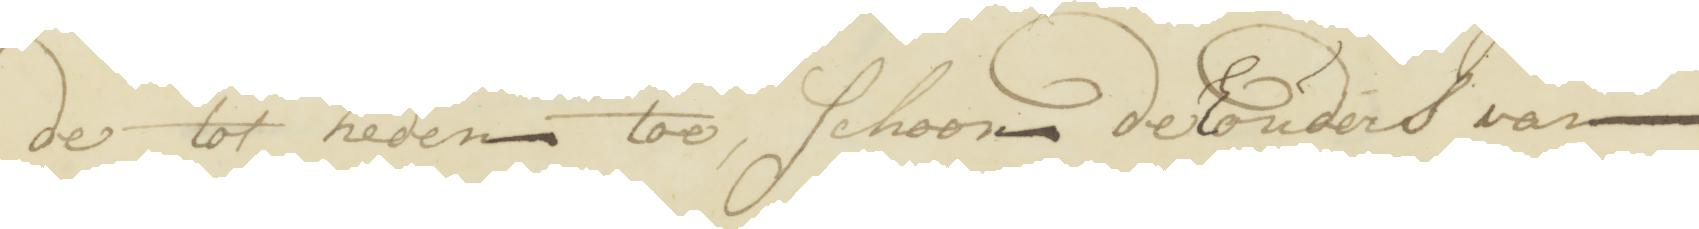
de tot heden toe, schoon de houders van
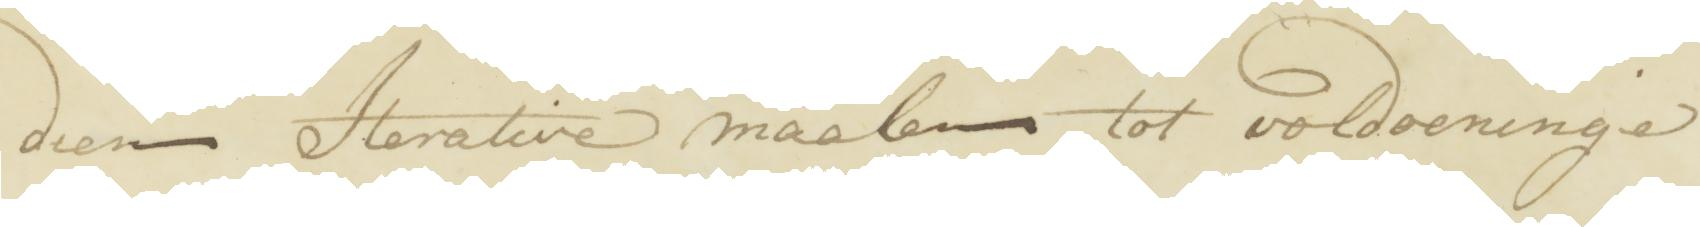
dien Jterative maalen tot voldoeninge
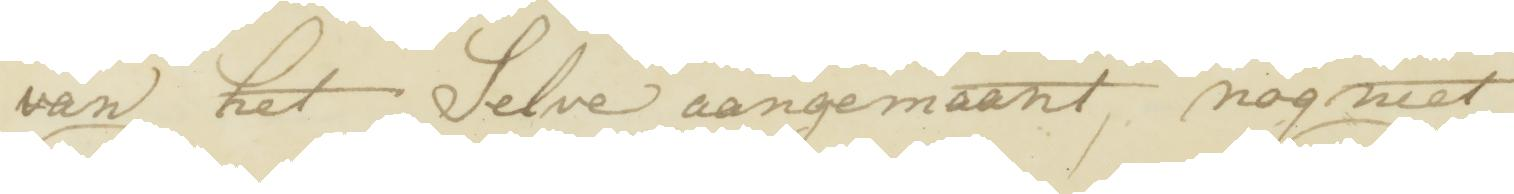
van het selve aangemaant, nog niet
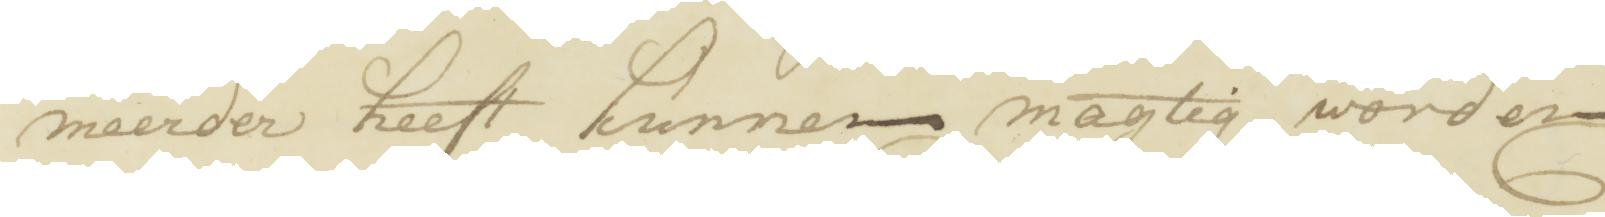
meerder heeft kunnen magtig worden
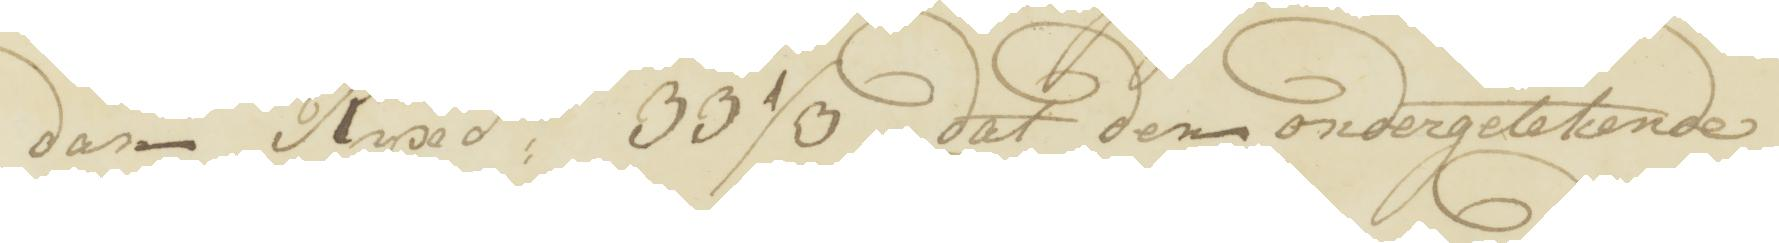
dan Ryxd„s 33 1/3 dat den ondergetekende
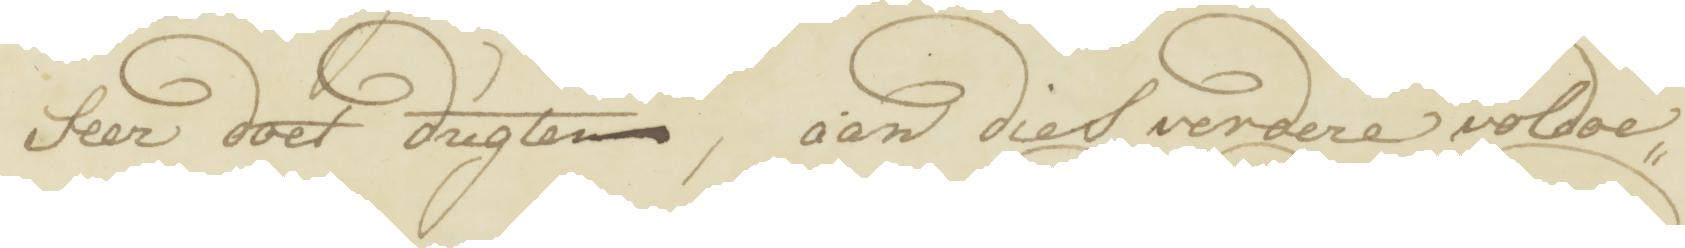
seer doet dugten, aan dies verdere voldoe„
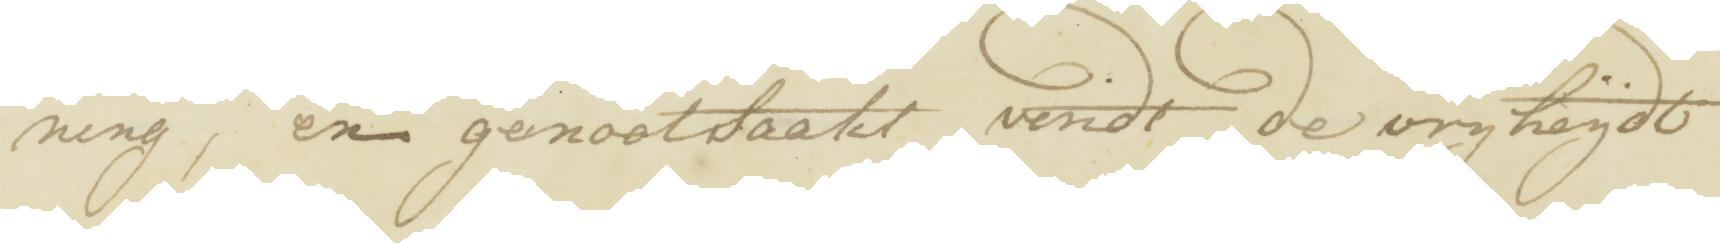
ning, en genootsaakt vindt, de vryheijdt
